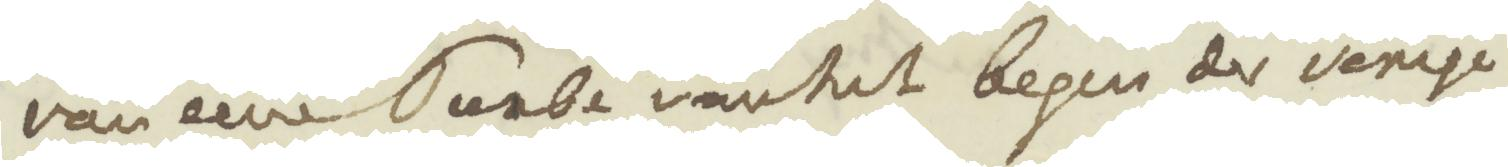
van een Tiende van het begin der vorige
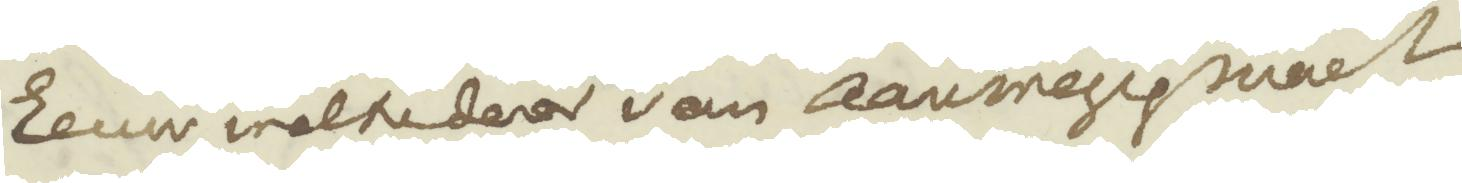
Eeuw welke daer van aanwezig moet
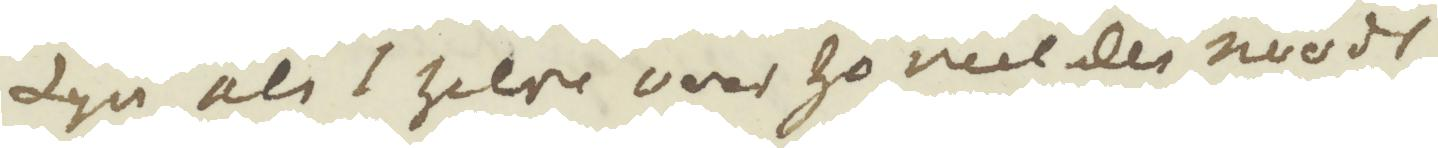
zyn als t zelve voor zo veel als des noods
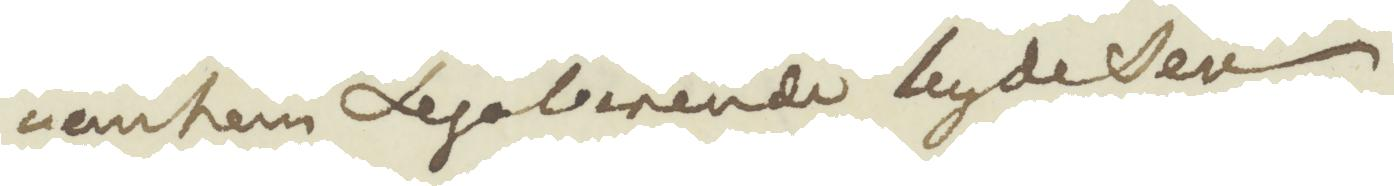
aen hem Legaterende bydesen
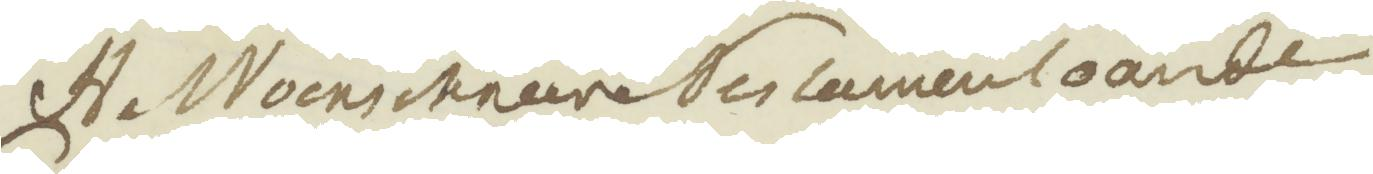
Het Voorschreeve Testament aan de
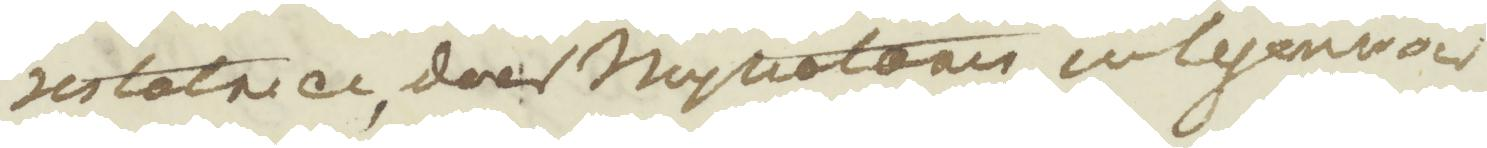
Testatrice, door my Notaris in tegenwoor
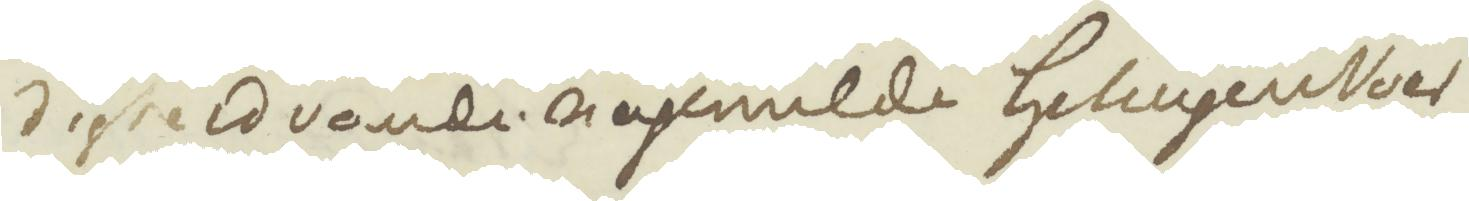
digheid van de nagemelde Getuygen Voor
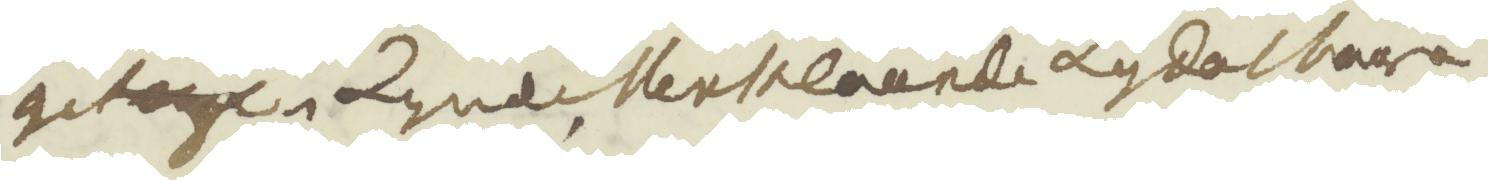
gelezen Zynde, verklaarde Zy dat haare
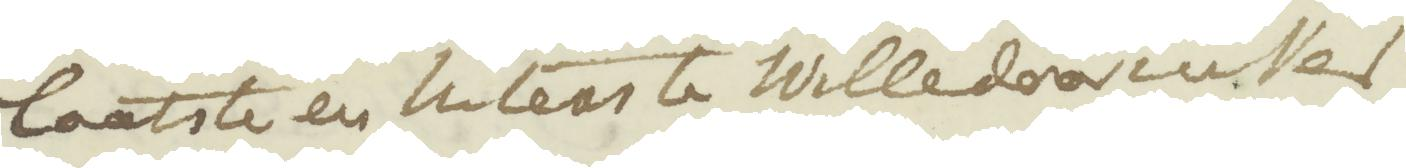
laatste en Uiterste Wille daer in Ver
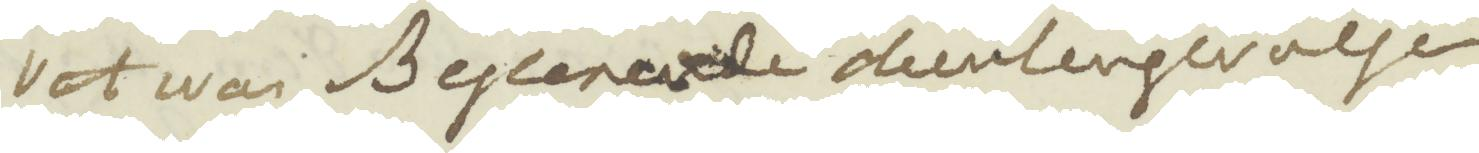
vat was Begeerende dientegevolge
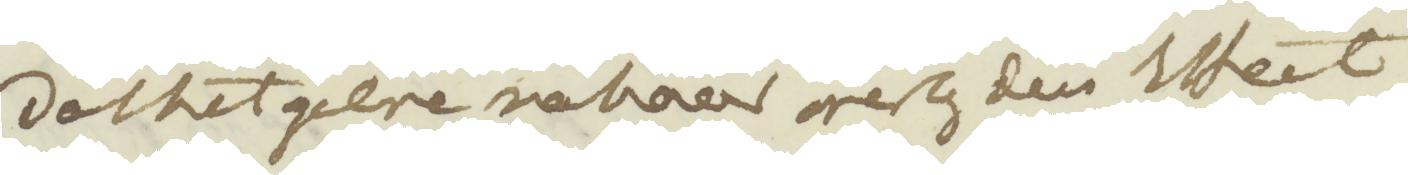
dat het zelve na haer overlyden Effect
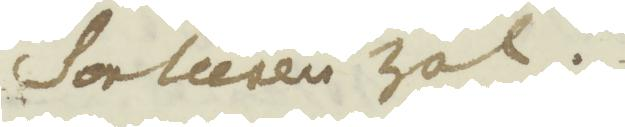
Sorteeren zal.
